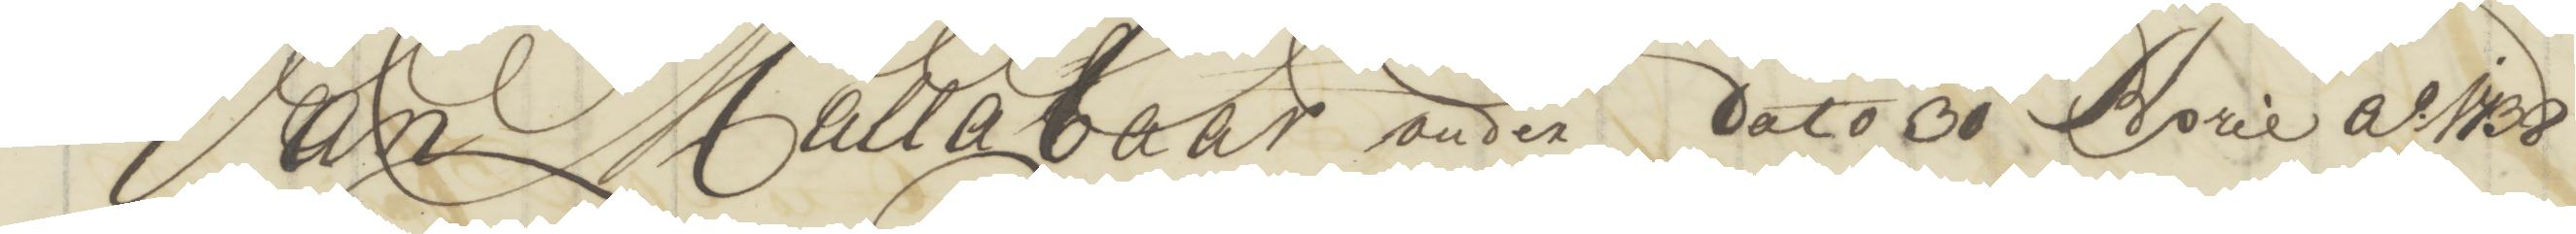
Van Mallabaar onder dato 30 April A.o 1738
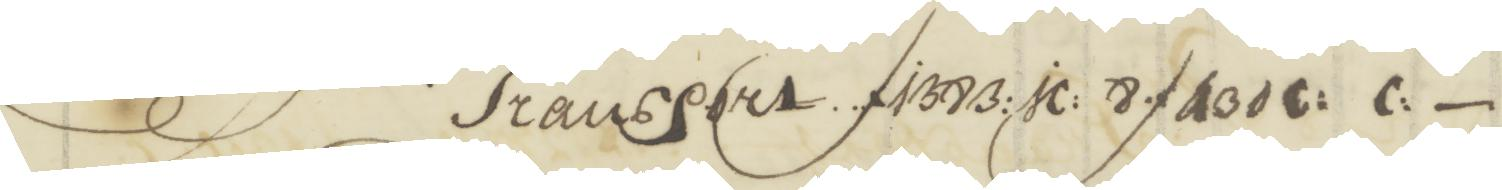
P:r Transport.. ƒ1383: 15: 8. ƒ4315: 5: —
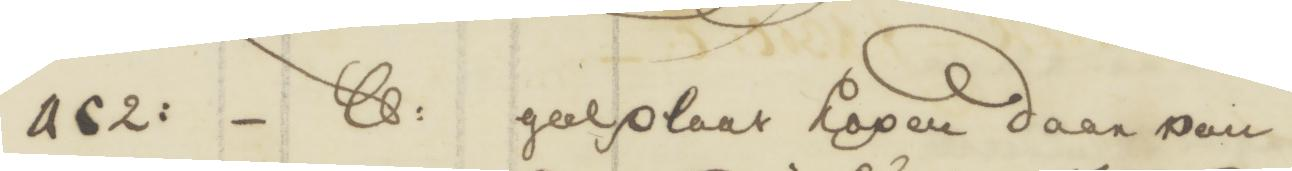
452: — lb: geel plaat koper daar van
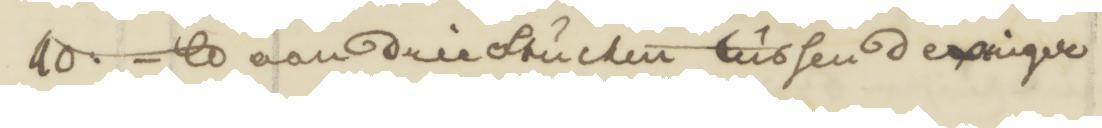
40: - lb aan drie stucken tussen de extriger
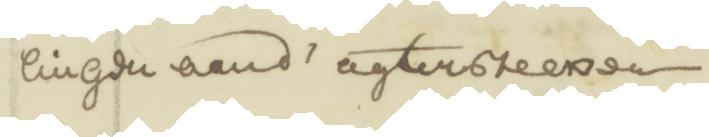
lingen aan d’ agtersteeven
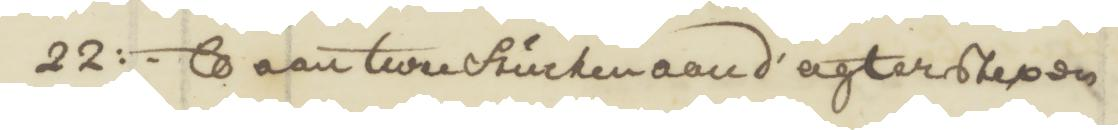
22:– lb aan twee stucken aan d’ agtersteven
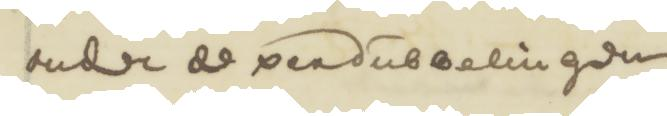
onder de verdubbelingen
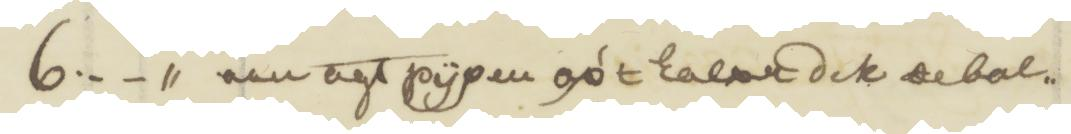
6.– – „ aan agt pijpen op 't halve dek de bal„
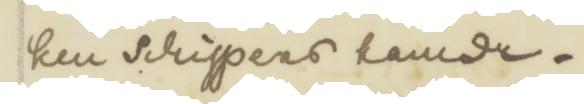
ken schippers kamer.
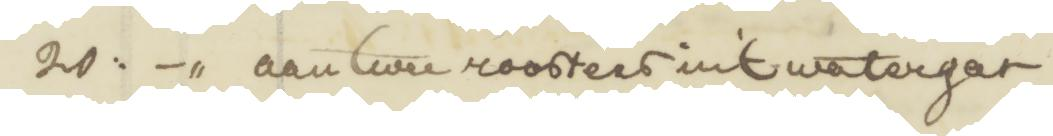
20: —„ aan twee roosters in't watergat
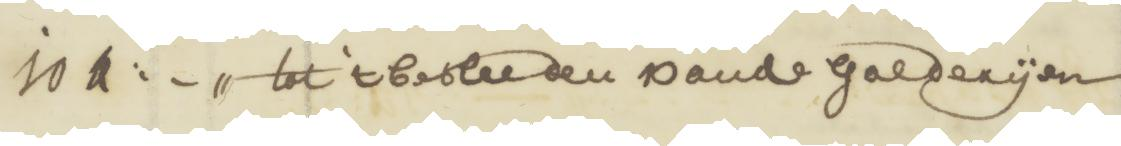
104: —„ tot ’t becleeden vande galderijen
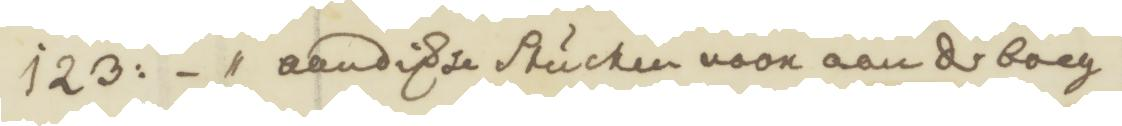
123: — „ aan diverse stucken voor aan de boeg
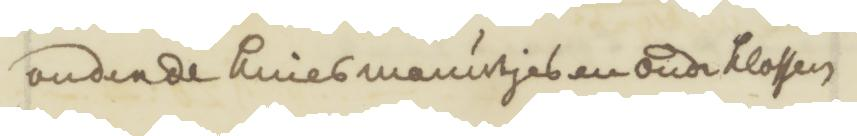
onder de knies manutjes en oude klossen
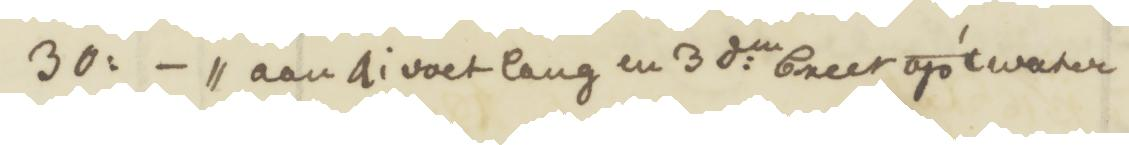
30: — „ aan 41 voet lang en 3 d:m breet op 't water
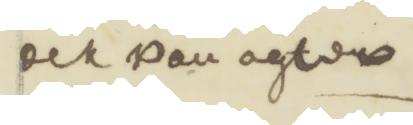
dek van agter
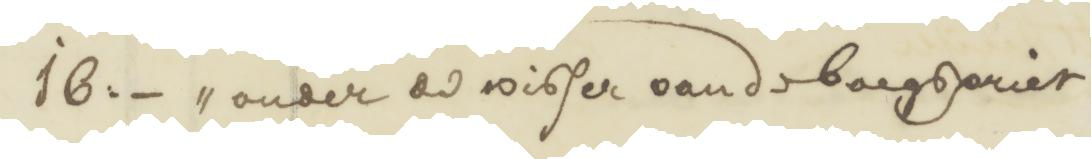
16: — „ onder de wisser van de boegspriet
